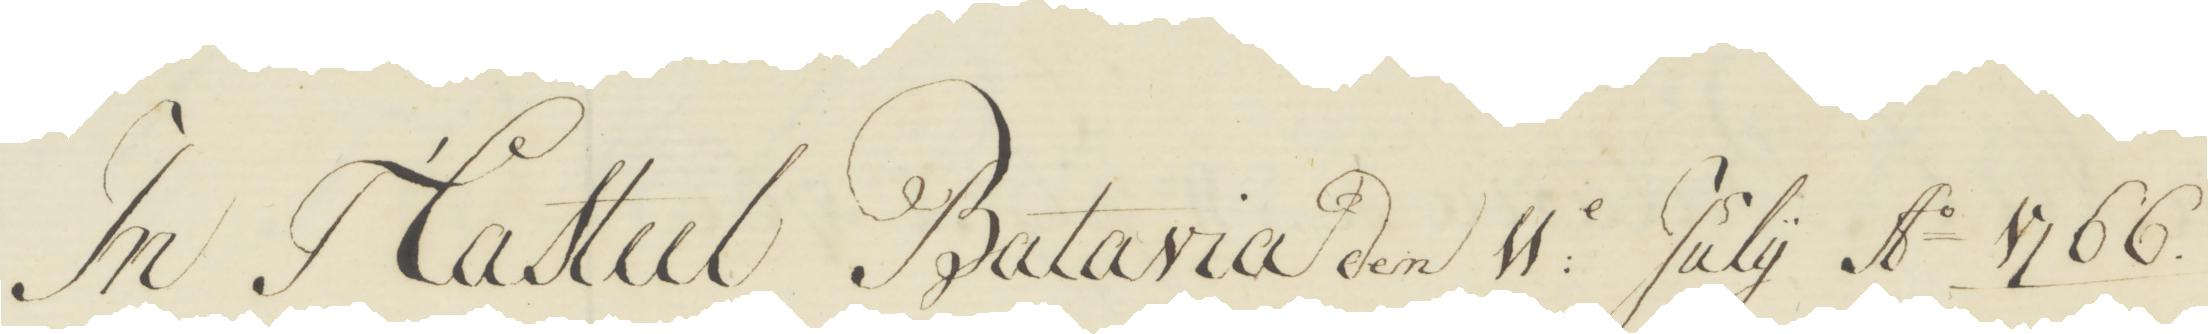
In T' Casteel Batavia den 11:e Julij A=o 1766.
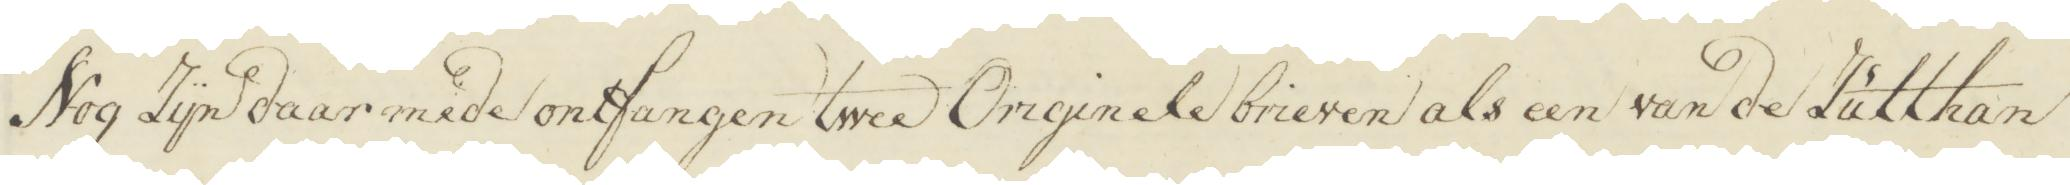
Nog zijn daarmede ontfangen twee Originele brieven als een van de Zulthan
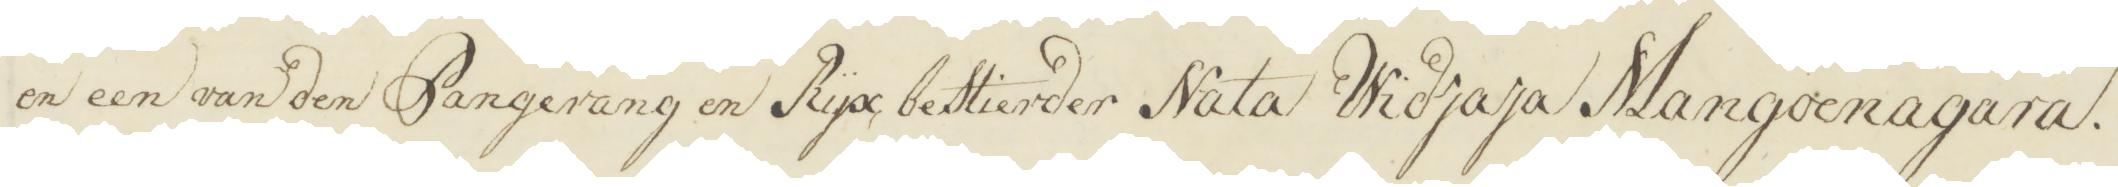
en een van den Pangerang en Rijx bestierder Nata Widjaja Mangoenagara.
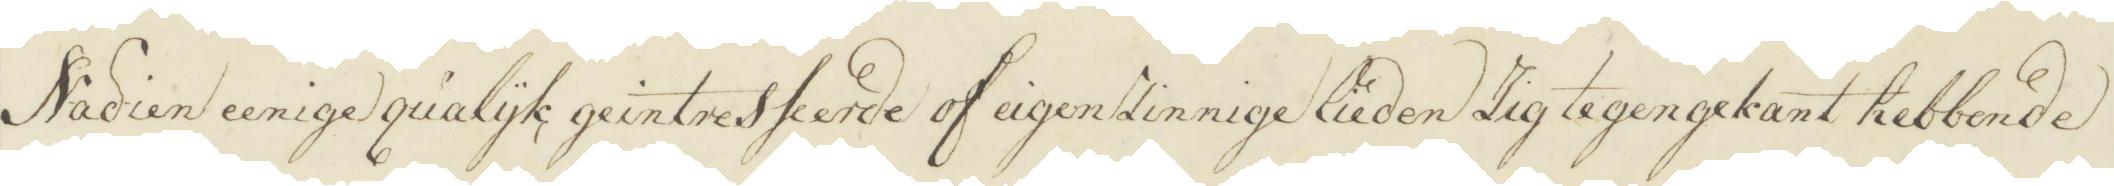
Nadien eenige qualijk geintresseerde of eigenzinnige lieden Zig tegengekant hebbende
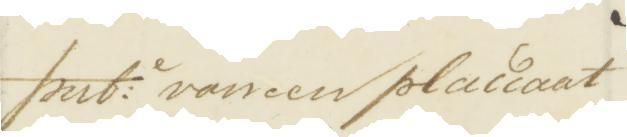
pub:e van een placcaat
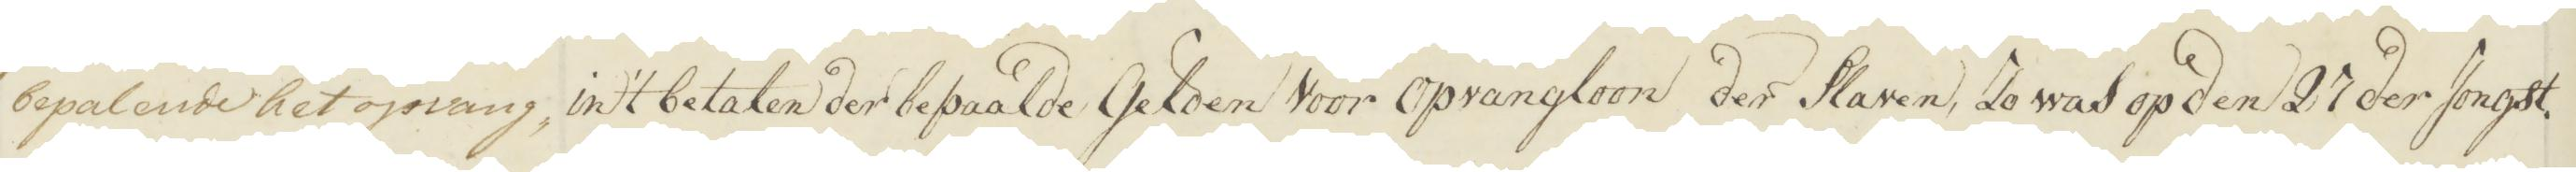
bepalende het opvang„ in ’t betalen der bepaalde gelden voor opvangloon der slaven, Zo was op den 27 der jongst.
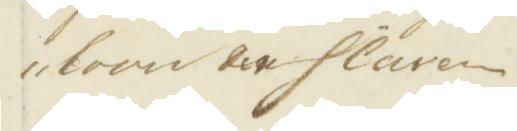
„loon der slaven
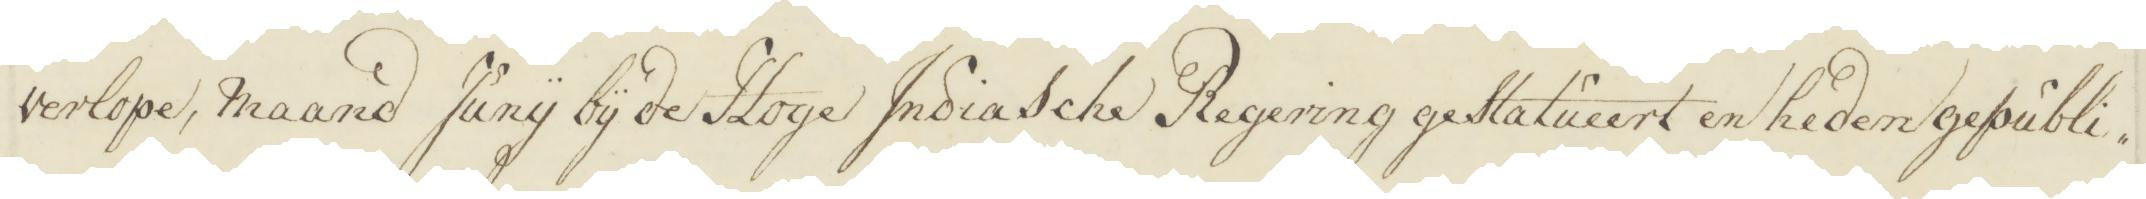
verlope maand Junij bij de Hoge Indiasche Regering gestatueert en heden gepubli„
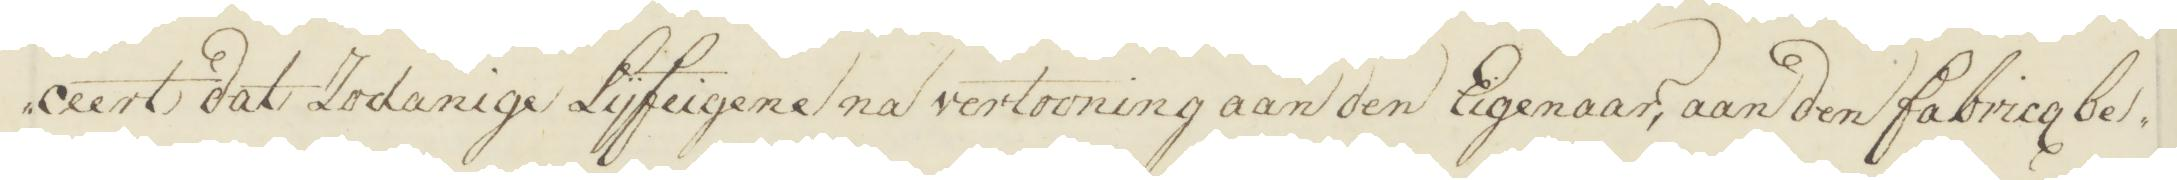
ceert dat Zodanige lijfeigene na vertooning aan den Eigenaar, aan den fabricq be„
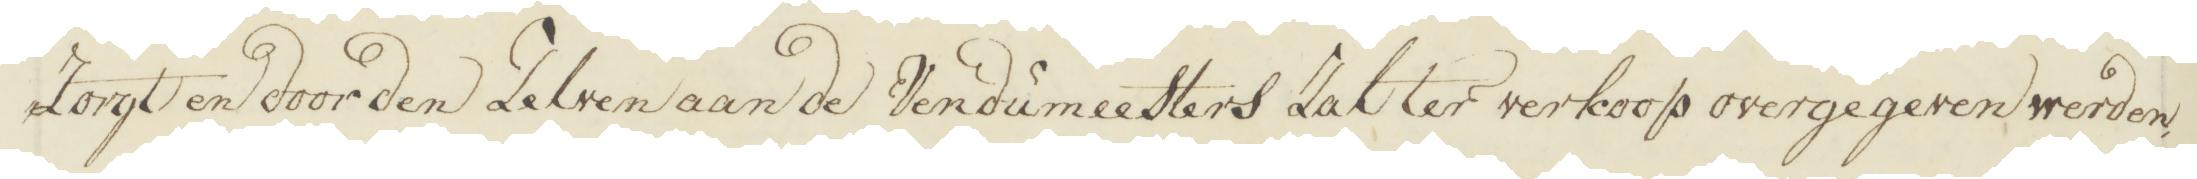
Zorgt en door den zelven aan de Vendumeesters zal ter verkoop overgegeven werden
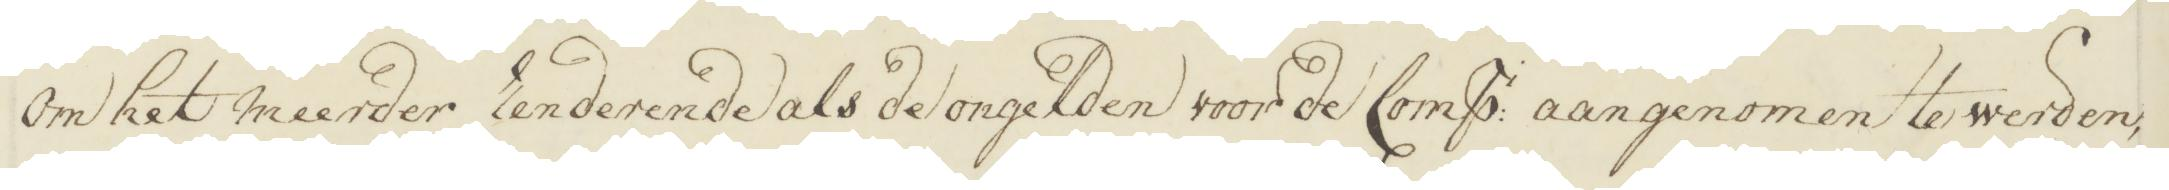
om het meerder Renderende als de ongelden voor de Comp:i aangenomen te werden,
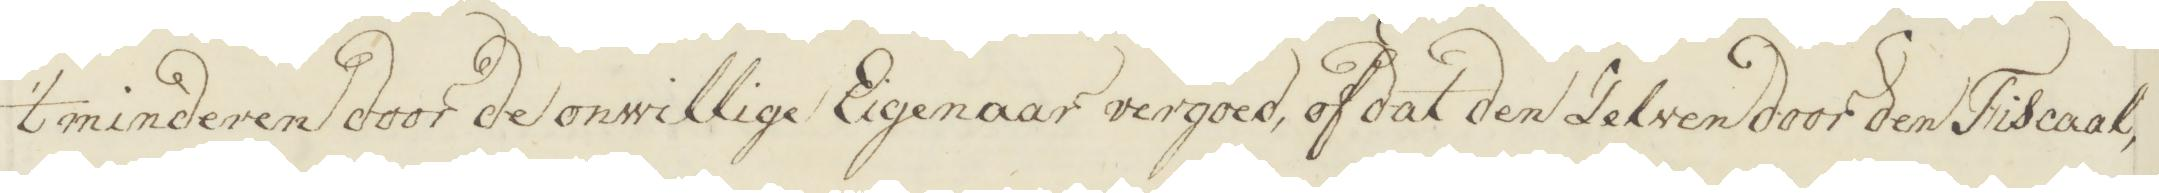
’t minderen door de onwillige Eigenaar vergoed, of dat den zelven door den Fiscaal,
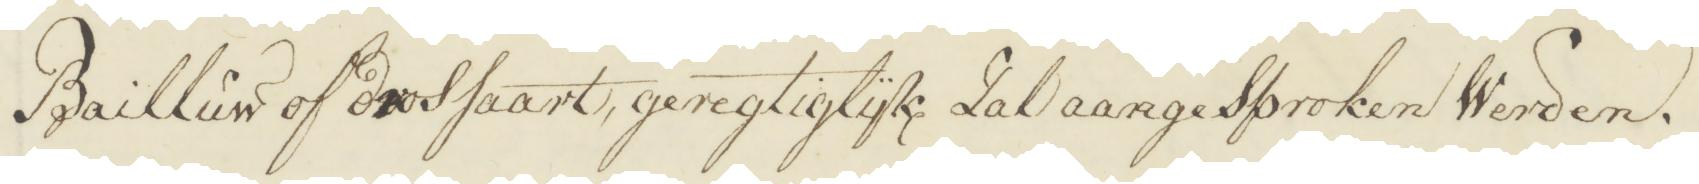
Bailluw of drossaart, geregtiglijk zal aangesproken werden.
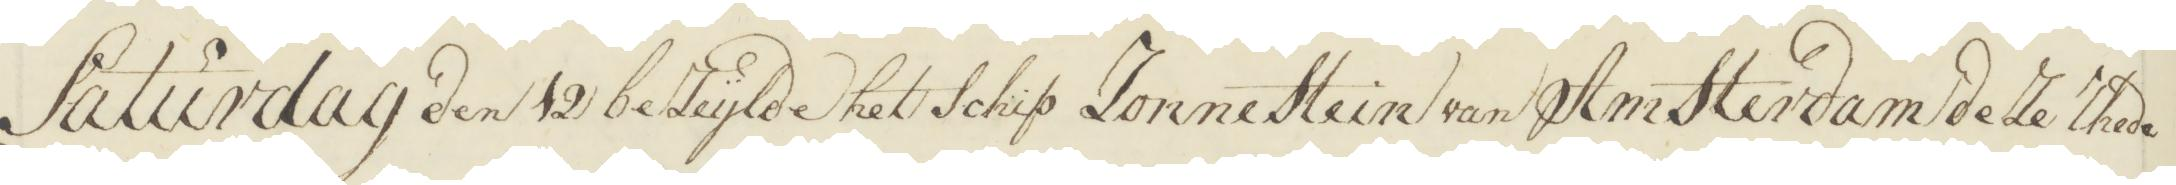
Saturdag den 12 bezeijlde het schip Zonnestein van Amsterdam deze rhede
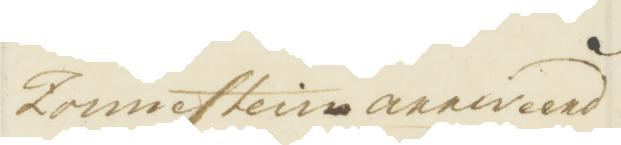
Zonnestein arriveerd
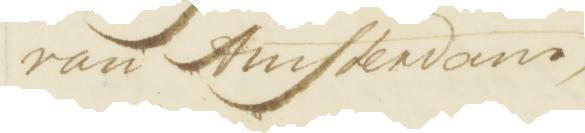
van Amsterdam,
